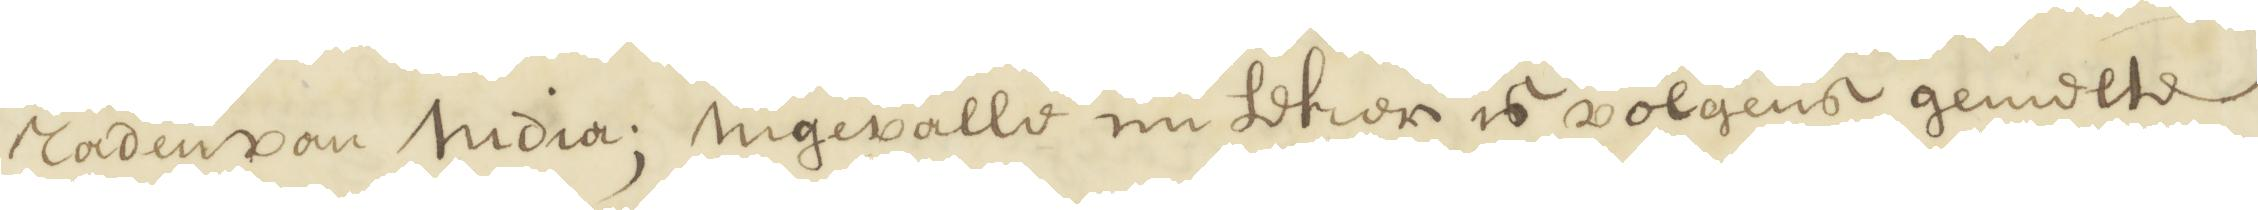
raden van India; ingevalle nu seker is volgens gemelte
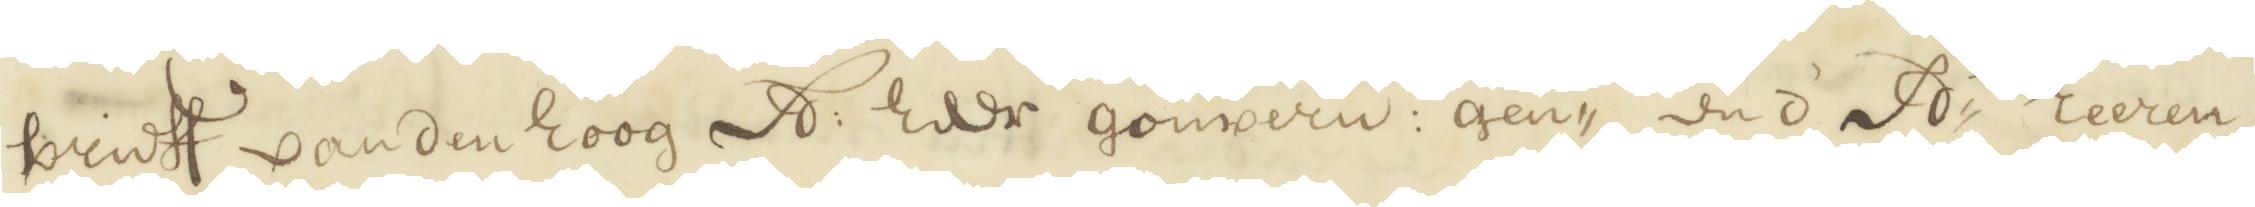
brieff van den hoog Ed: heer gouvern: gen„l en d’ Ed„le heeren
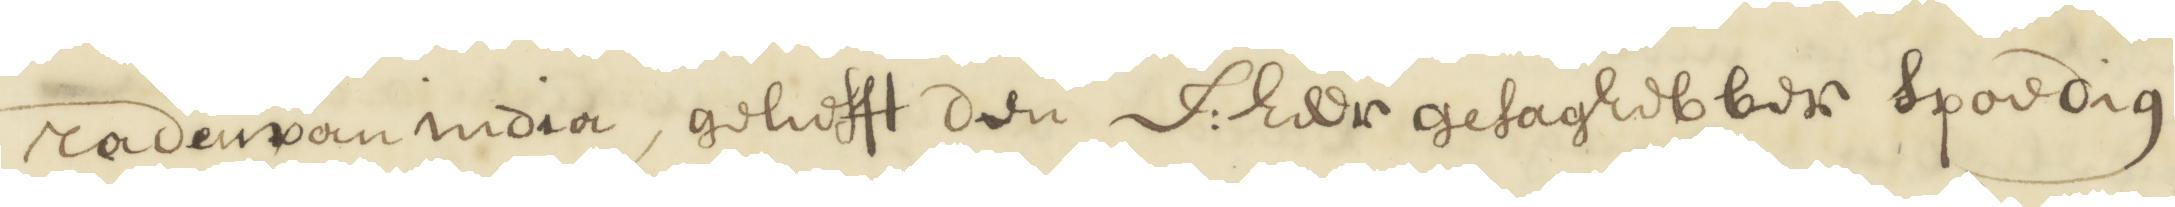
raden van india, geliefft den E: heer gesaghebber spoedig
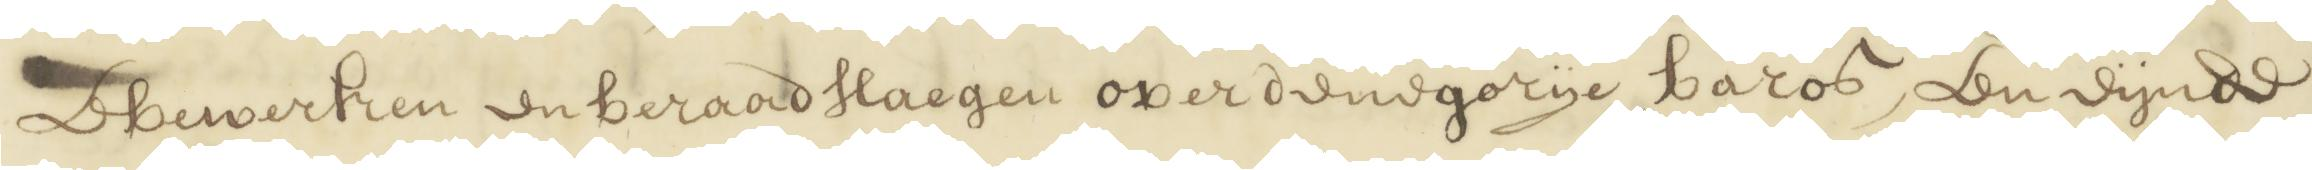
te bewerken en beraadslaegen over de negorije baros, en eijnde
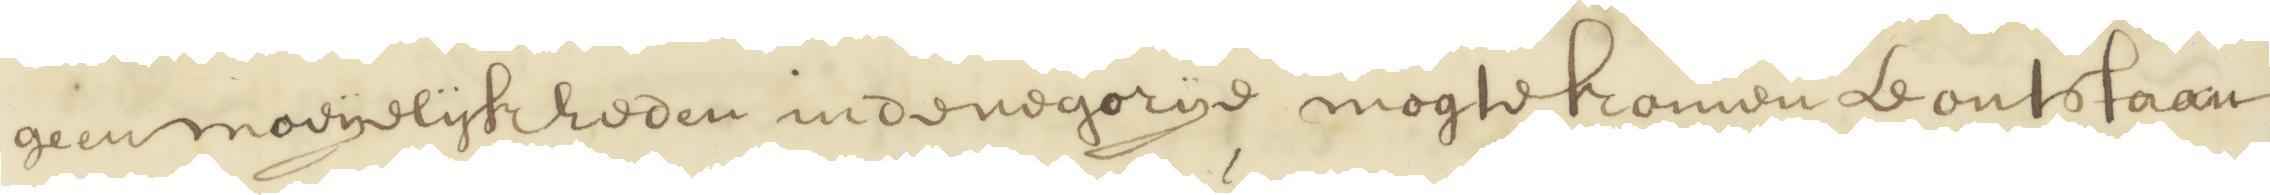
geen moeijelijkheden in de negorije mogte komen te ontstaan
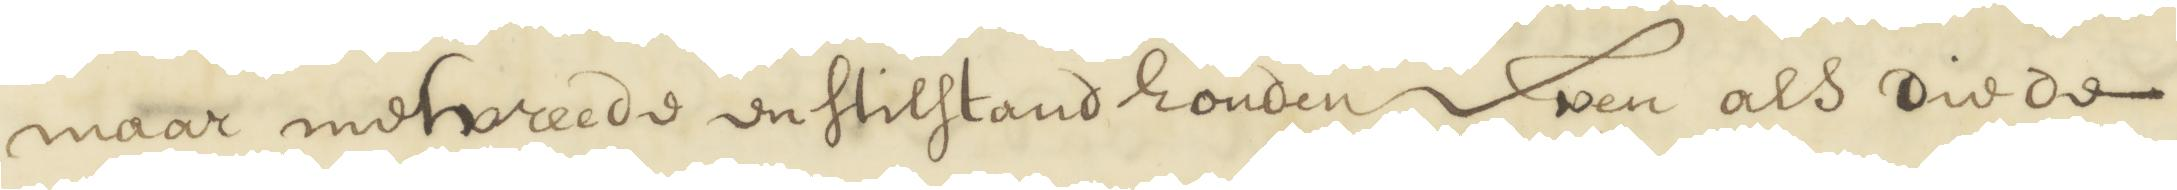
maar met vreede en stilstand houden Even als die de
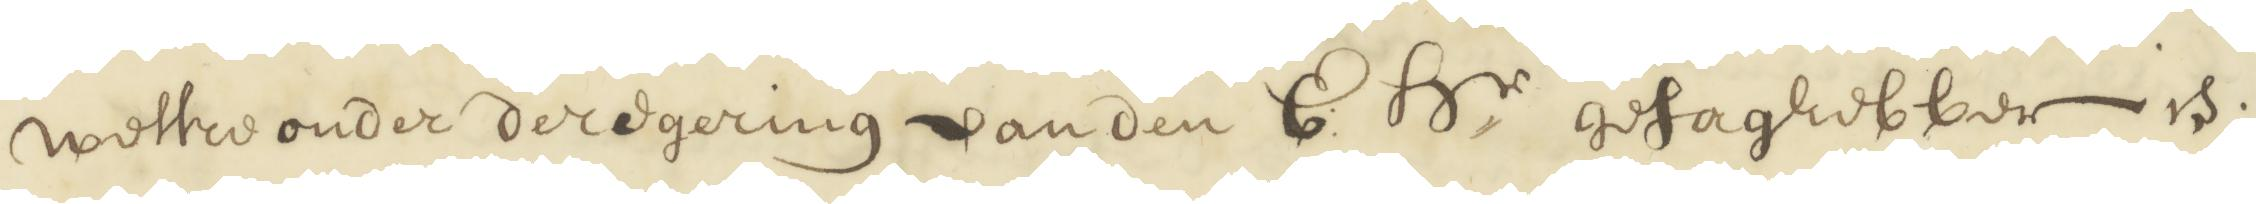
welke onder de regering van den E: H„r gesaghebber is;
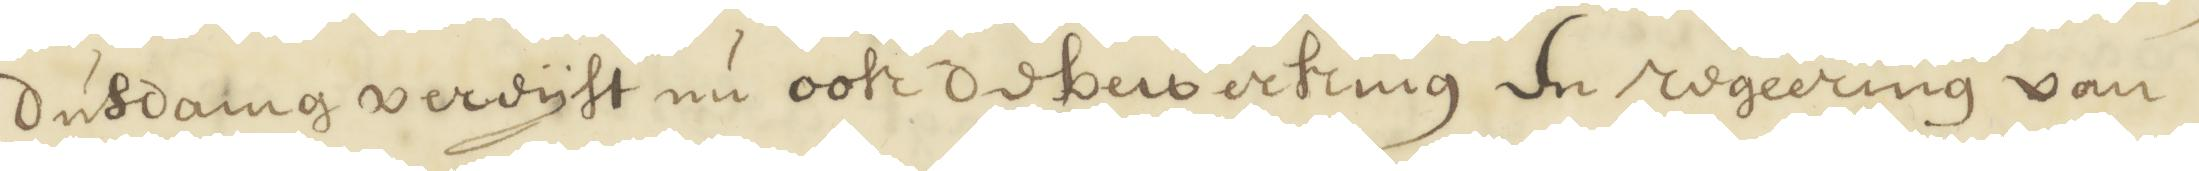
dusdanig vereijst nu ook de bewerking en regeering van
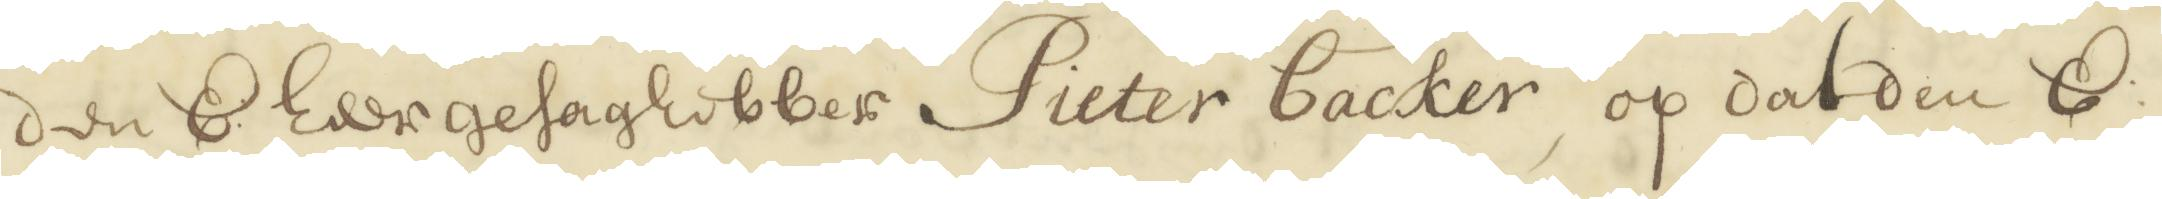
den E: Heer gesaghebber Pieter backer, op dat den E:
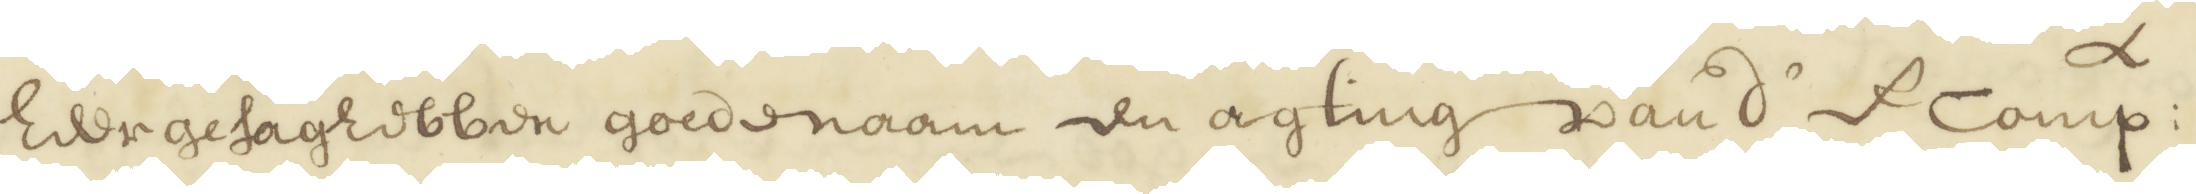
heer gesaghebber goede naam en agting van d’ E Comp:
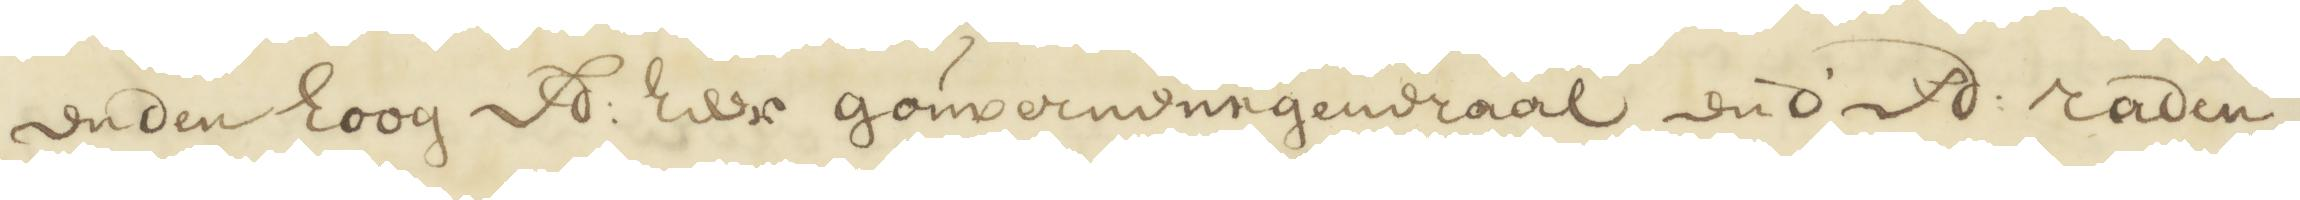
en den Hoog Ed: heer gouverneur generaal en d’ Ed: raden
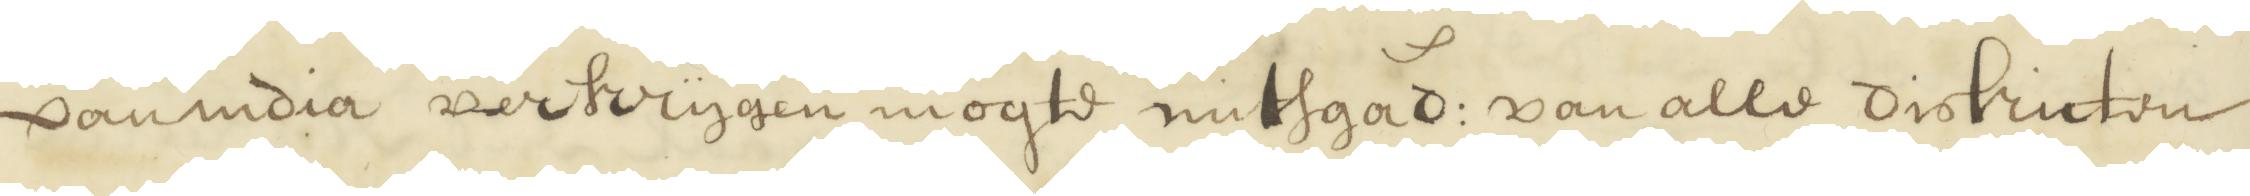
van india verkrijgen mogte mitsgad: van alle districten
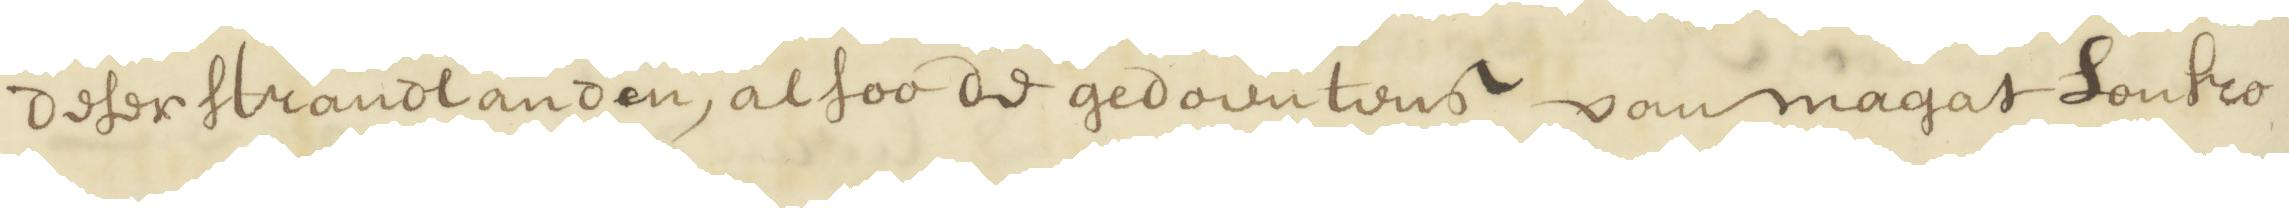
deser strandlanden, alsoo de gedoentens van magat sonko
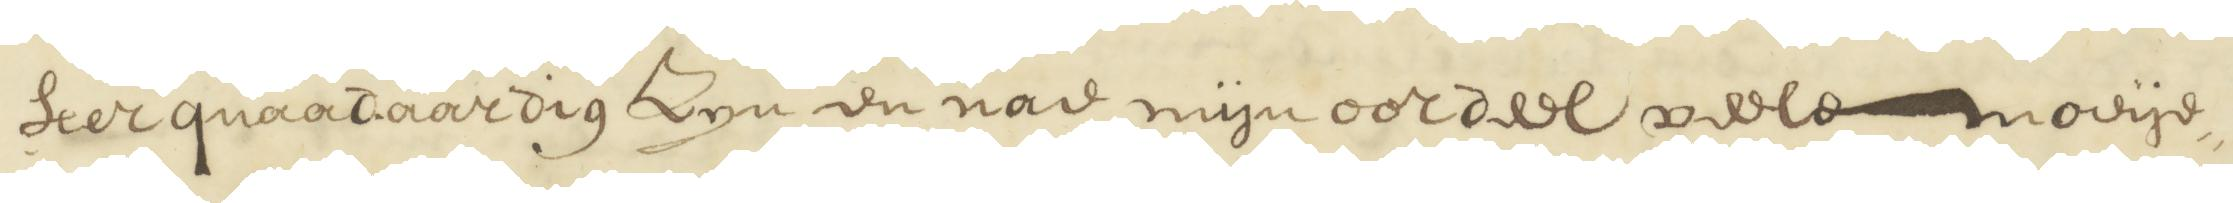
seer quaadaardig zijn en nae mijn oordeel veele moeije„
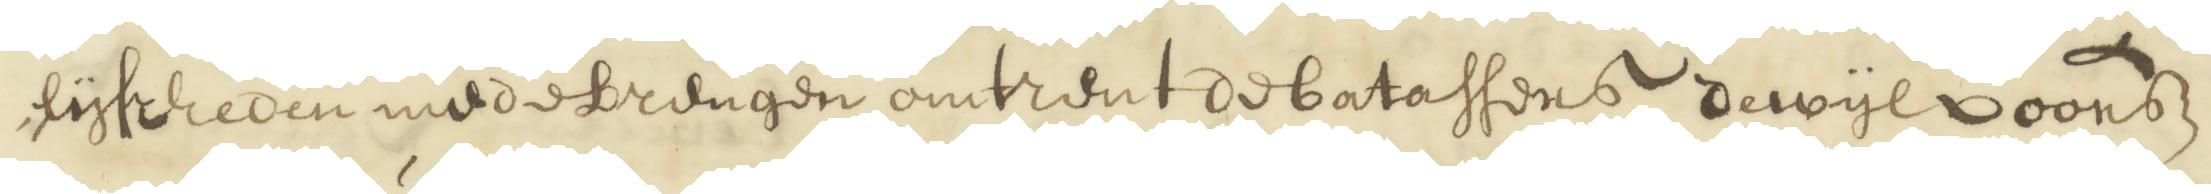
„lijkheden medebrengen omtrent de batassers dewijl voorsz:
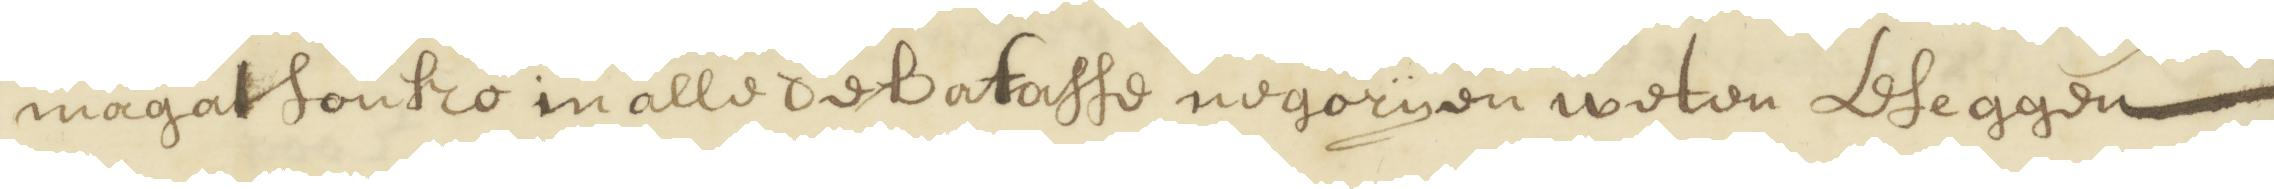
magatsouko in alle de batasse negorijen weten te seggen
